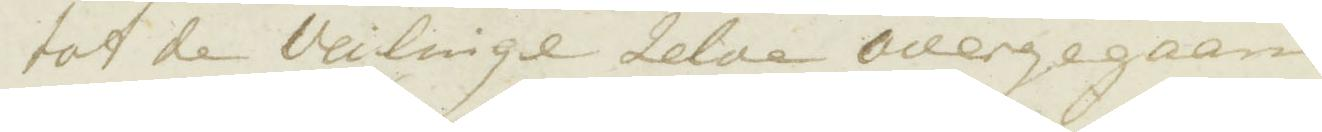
tot de veilinge zelve overgegaan
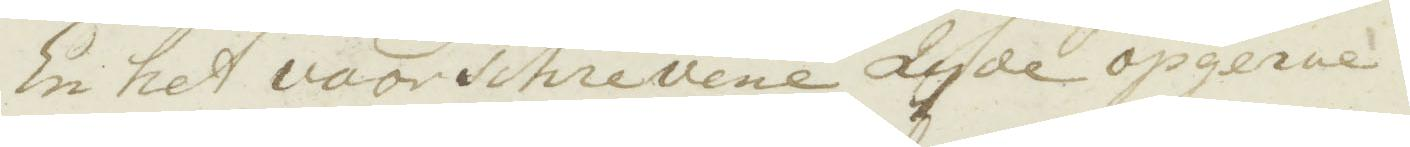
En het voorschrevene Zyde opgeroe
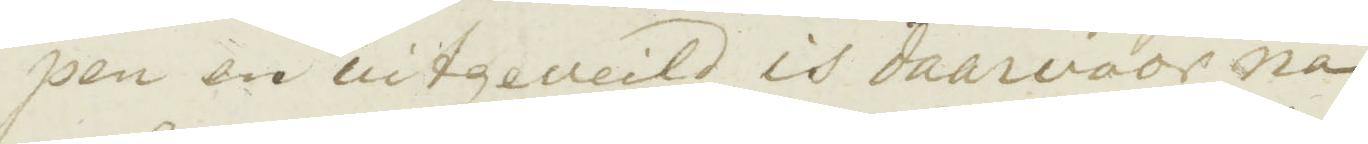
pen en uitgeveild is daarvoor na
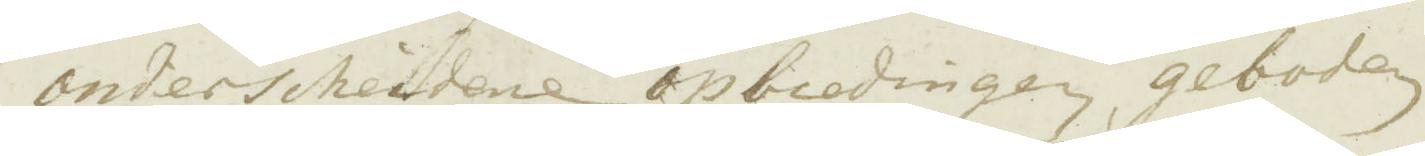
onderscheidene opbiedingen geboden
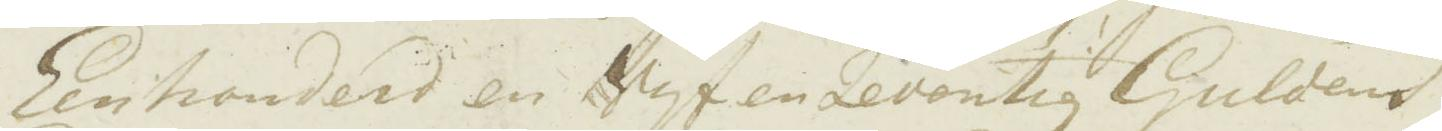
Een honderd en Vyf en Zeventig Guldens
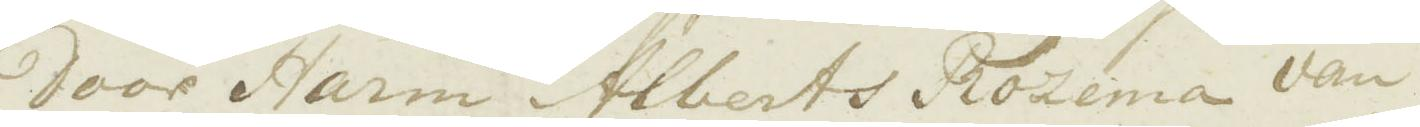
door Harm Alberts Rozema van
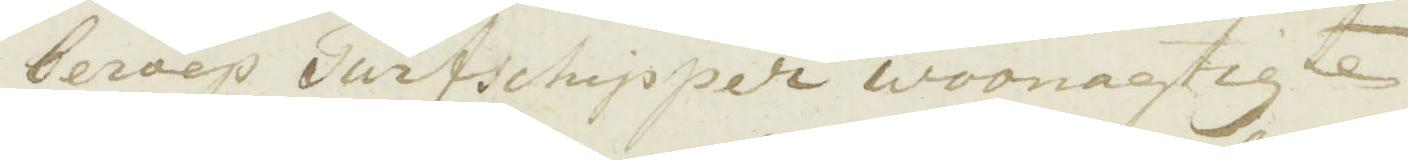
beroep Turfschipper woonagtig te
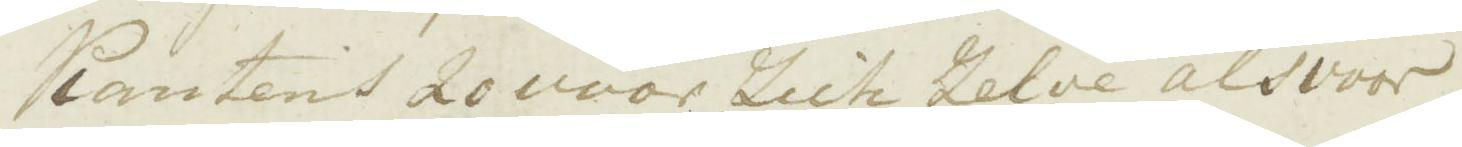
Kantens zo voor Zich Zelve als voor
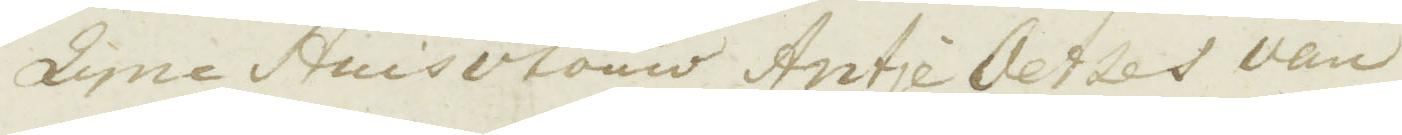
Zyne Huisvrouw Antje Oetzes van
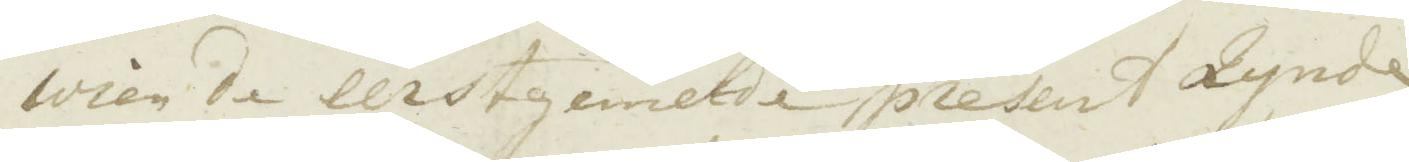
wien de eerstgemelde present Zynde
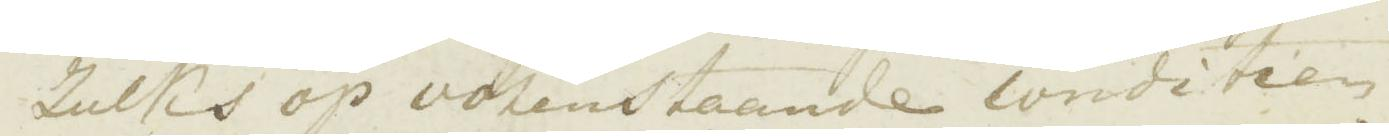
Zulks op vorenstaande conditien
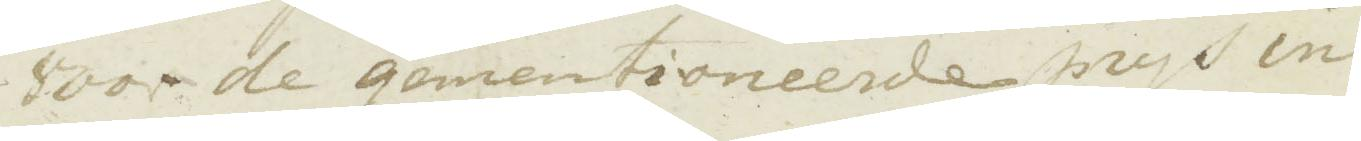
voor de gementioneerde prys in
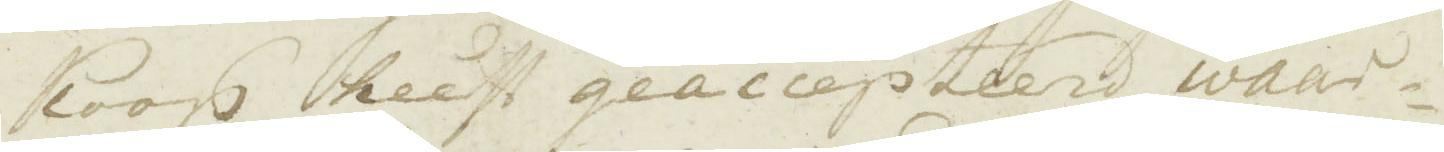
Koop heeft geaccepteerd waar=
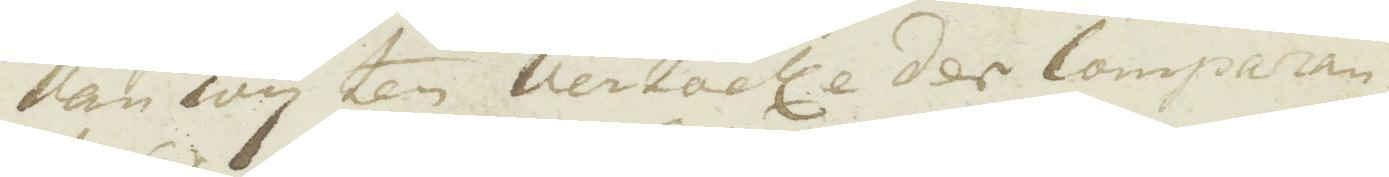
van wy ten verzoeke der Comparan
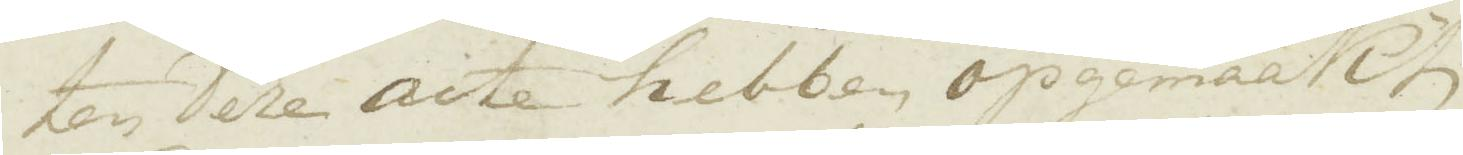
ten deze acte hebben opgemaakt
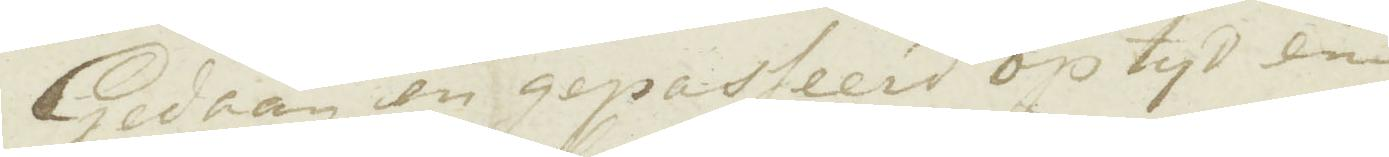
Gedaan en gepasseerd op tyd en
